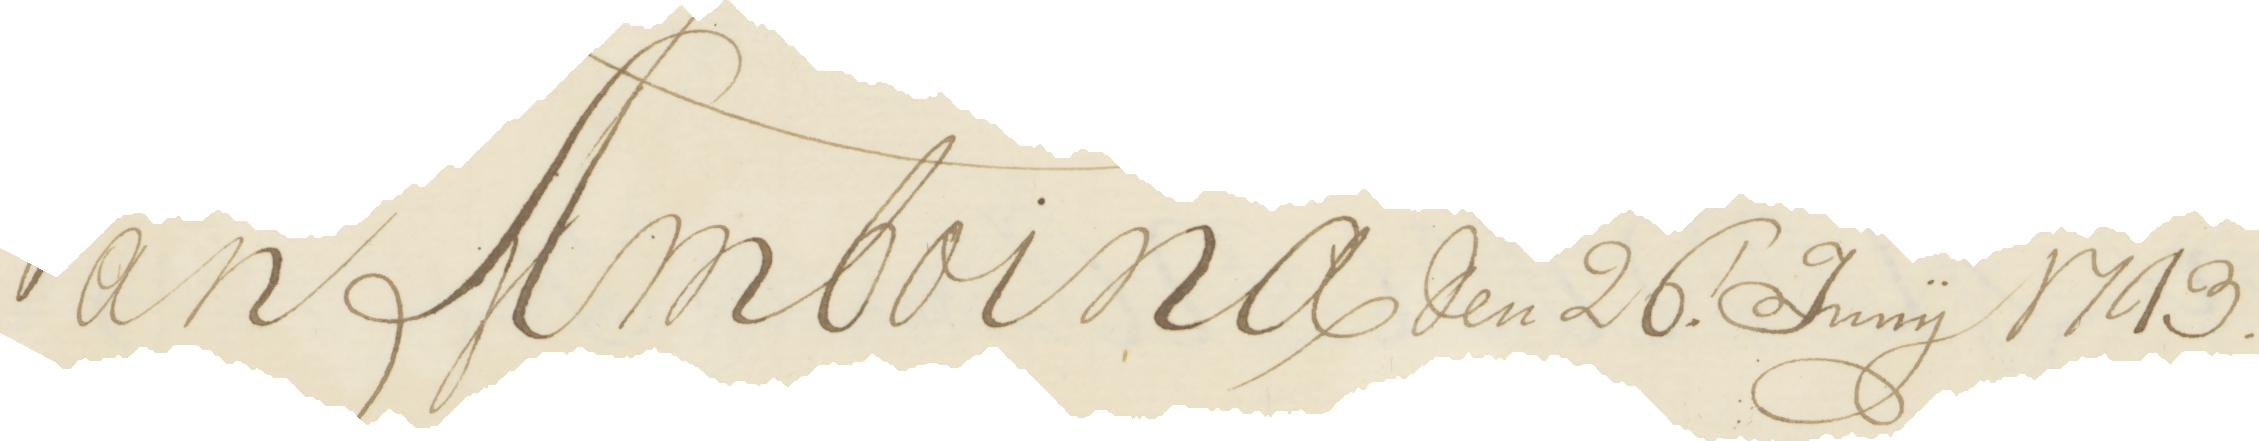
Van Amboina den 26:' Iunij 1743
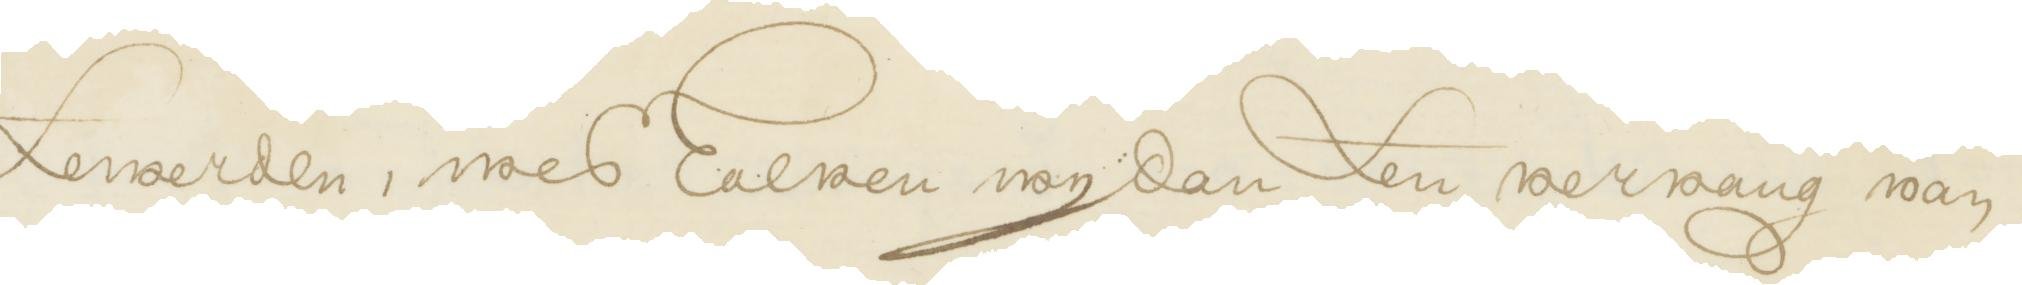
tewerden, wes halven wy dan ten vervang van
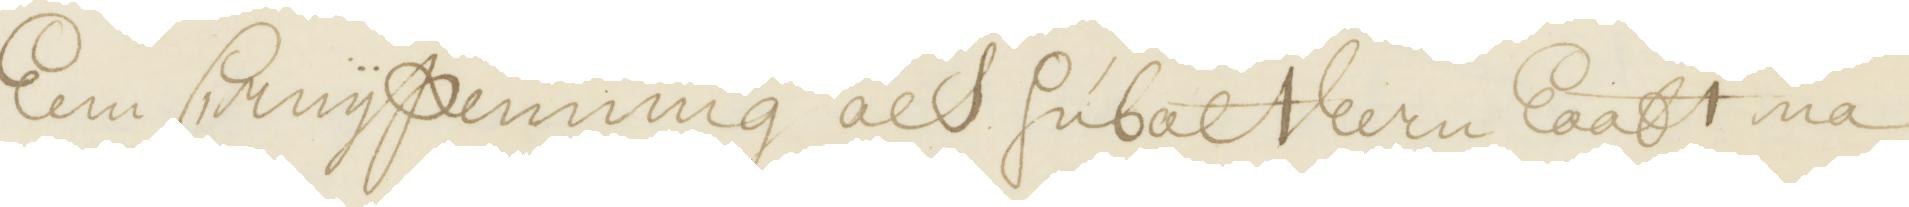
hem Cruijpenning als subalthern hooft na
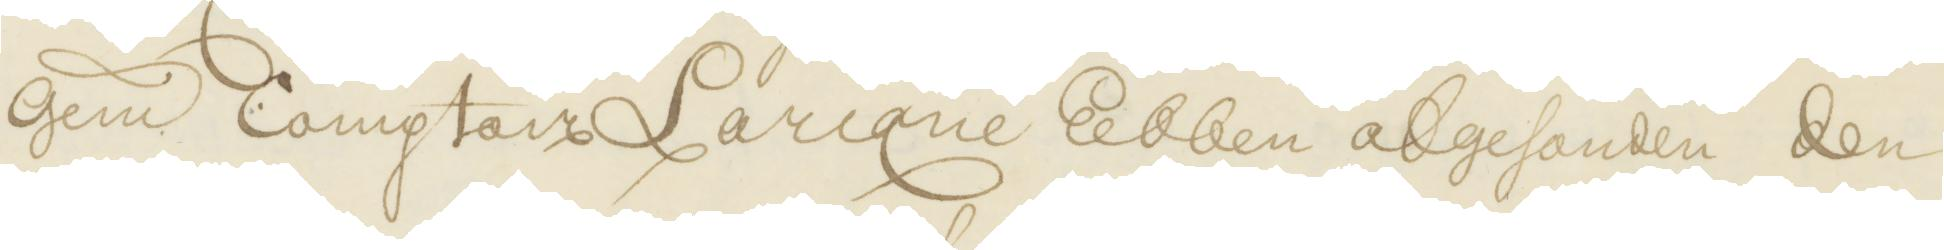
gem Comptoir Larique hebben afgesonden den
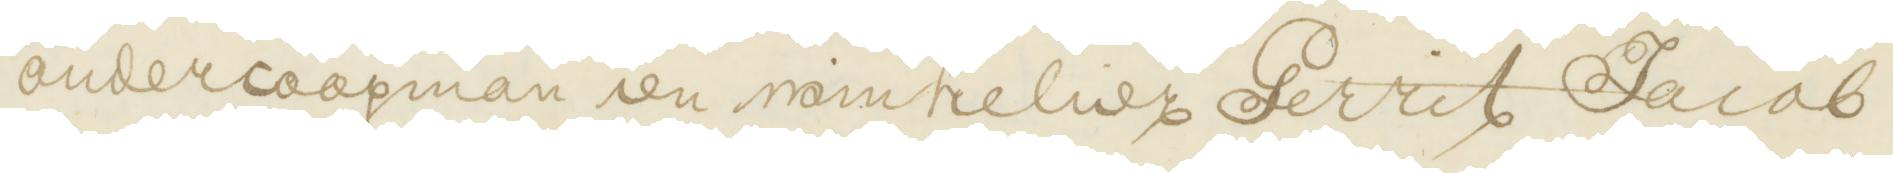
ondercoopman en winkelier Gerrit Iacob
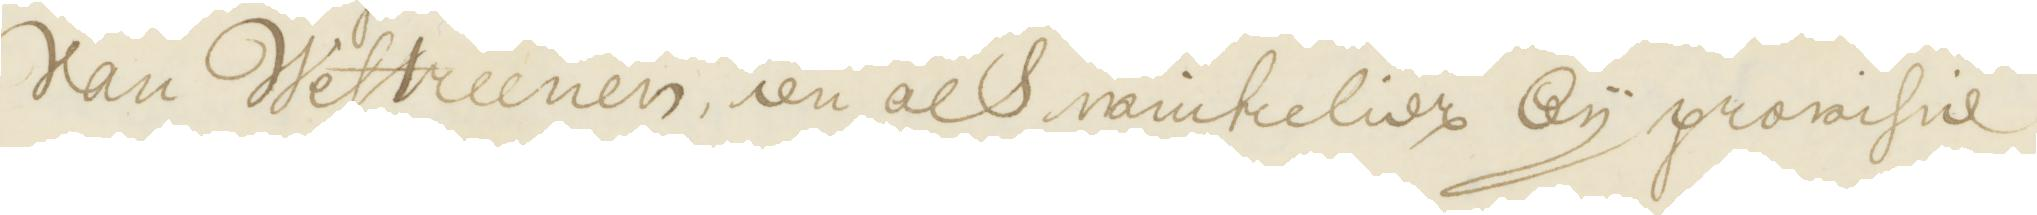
Van Westreenen, en als winkelier bij provisie
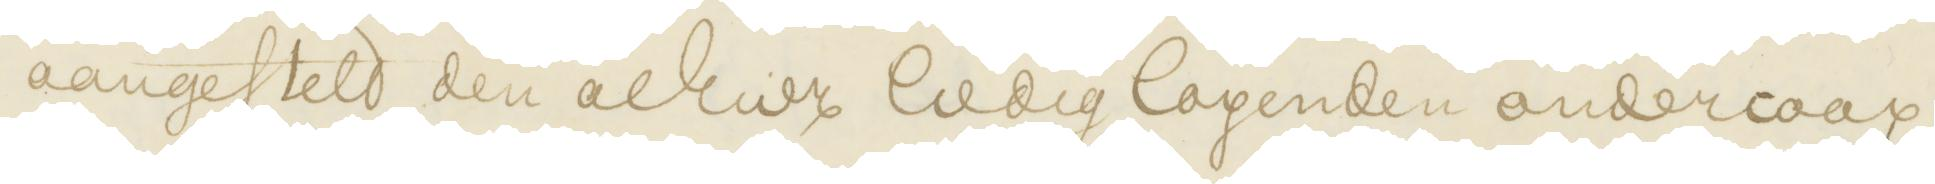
aangesteld den alhier ledig lopenden ondercoop
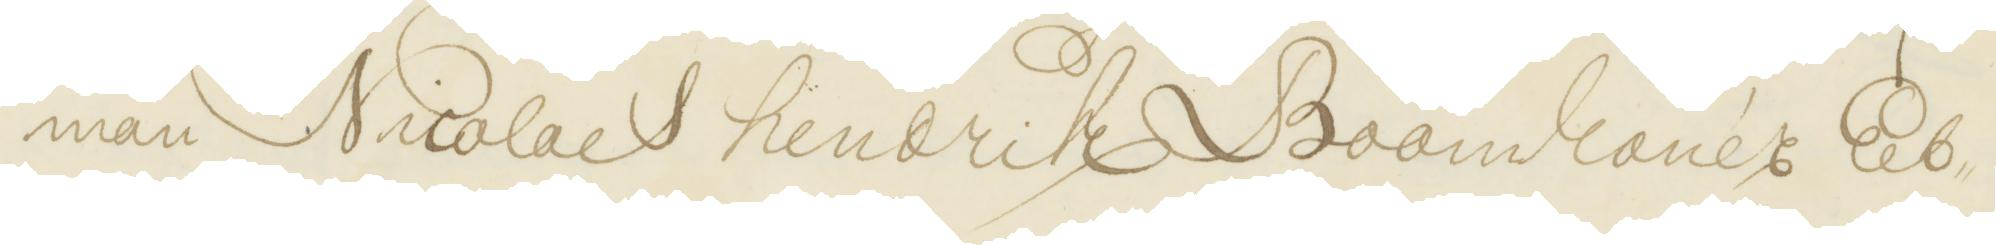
man Nicolaes hendrik Boomhouer heb„
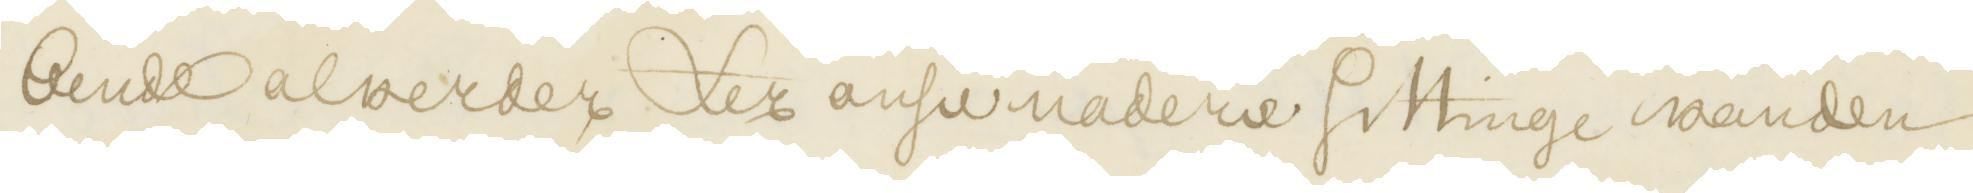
bende alverder ter onse nadere Sittinge vanden
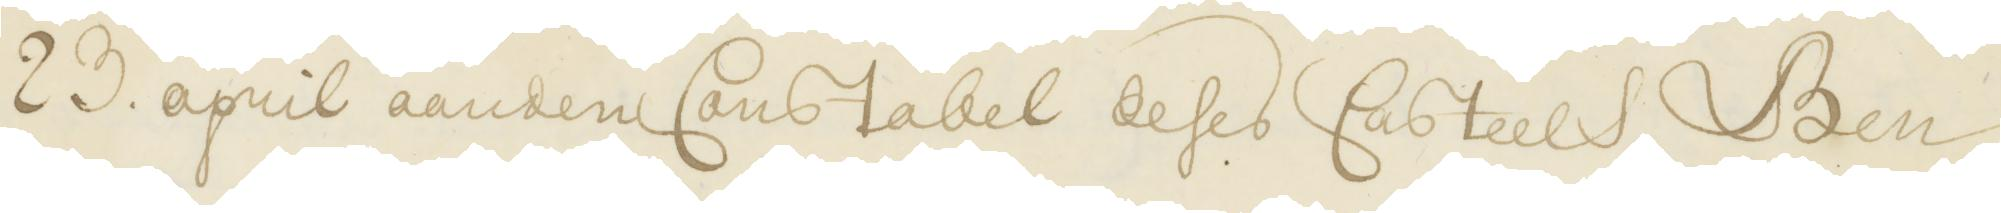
23. april aan den Constabel deses Casteels Ben
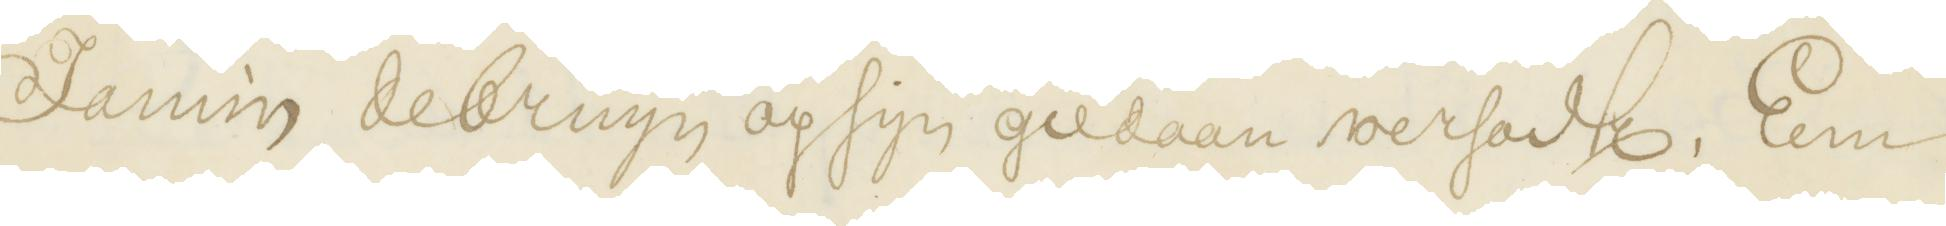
Iamin de bruijn op sijn gedaan versoek, hem
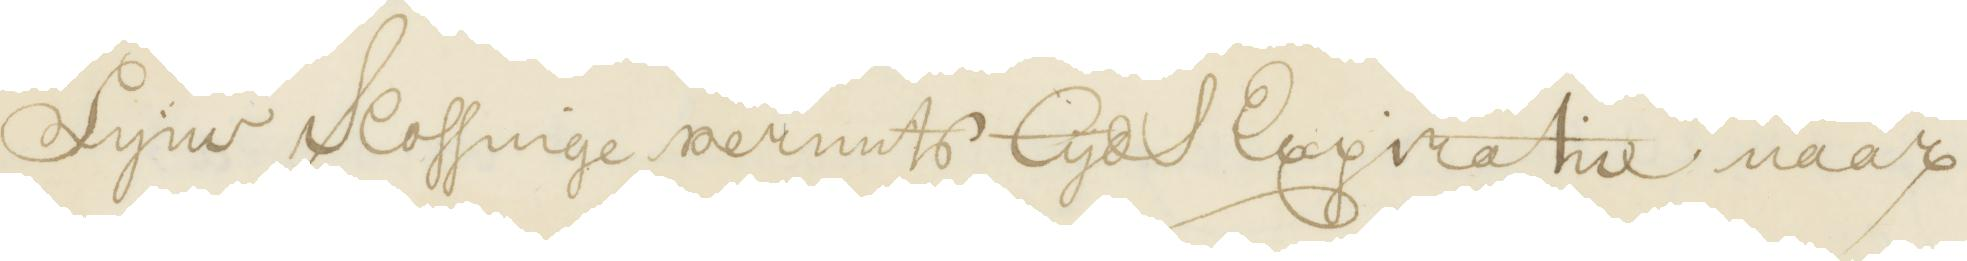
Sijne Verlossinge vermits tijds Expiratie naar
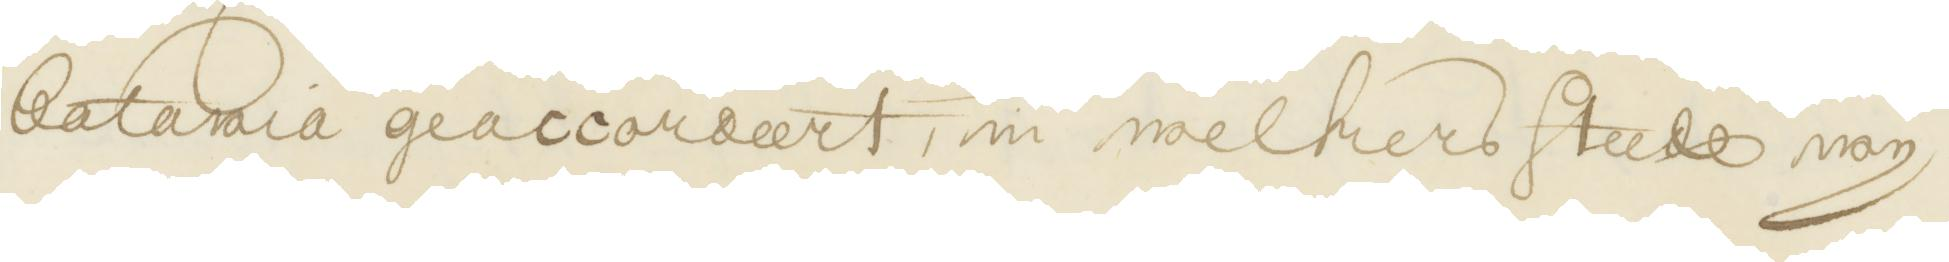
batavia geaccordeert, in welkers steede wij
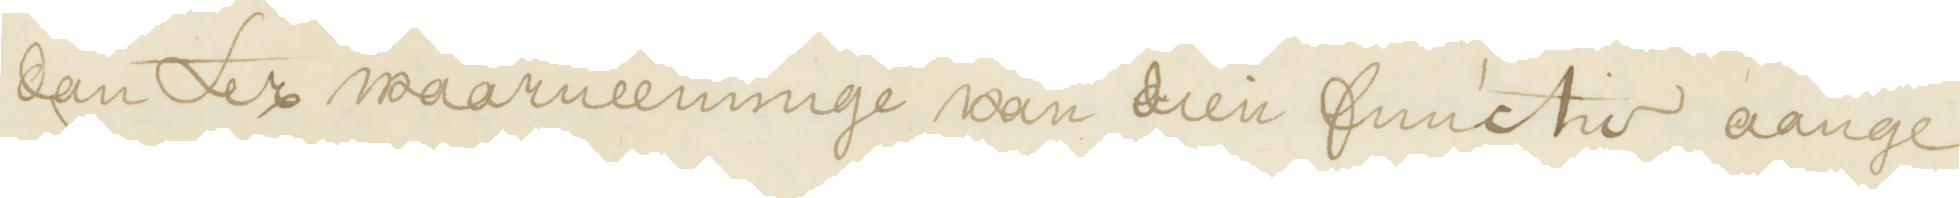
dan ter waarneeminge van dien functie aange
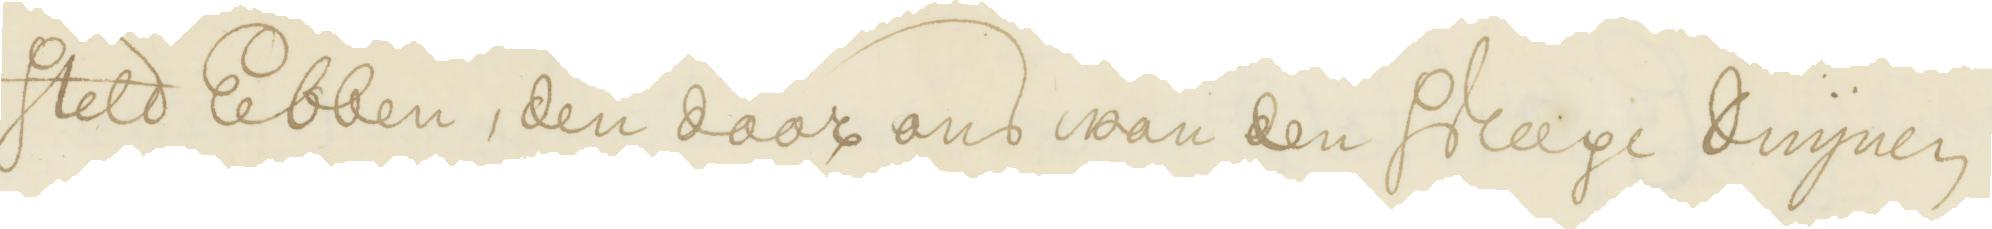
steld hebben, den door ons van den scheepe Duijnen
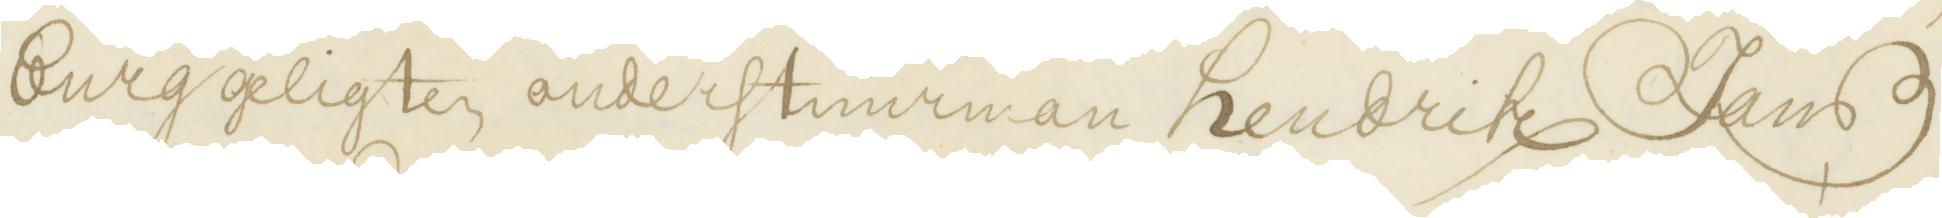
burg geligten onderstuurman hendrik Ians
